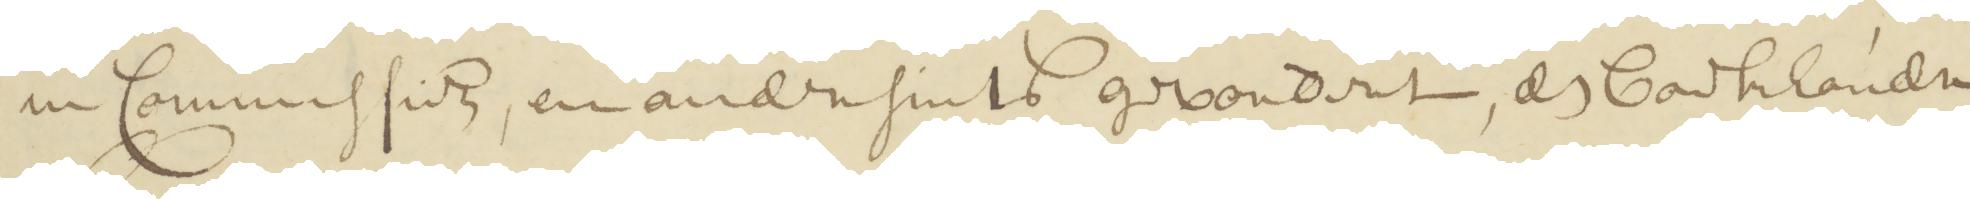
in commissien, en andersints gevordert, den boekhouder
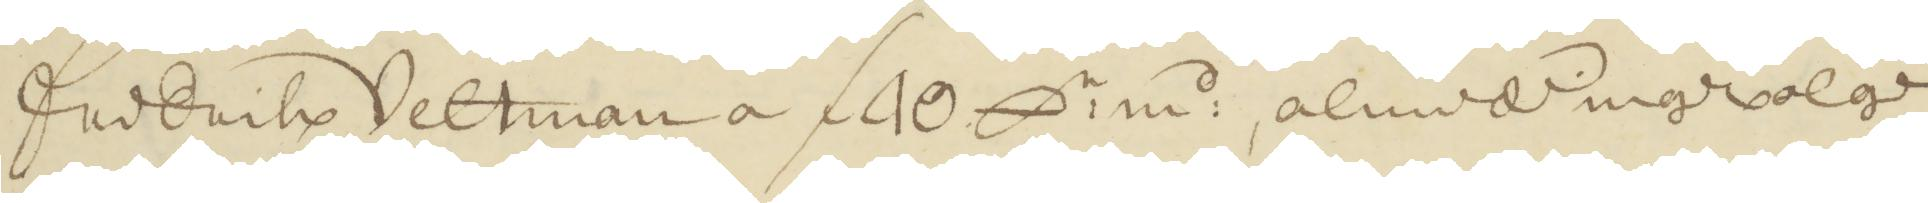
Fredrik Veltman a ƒ40 p:r m:d, almede ingevolge
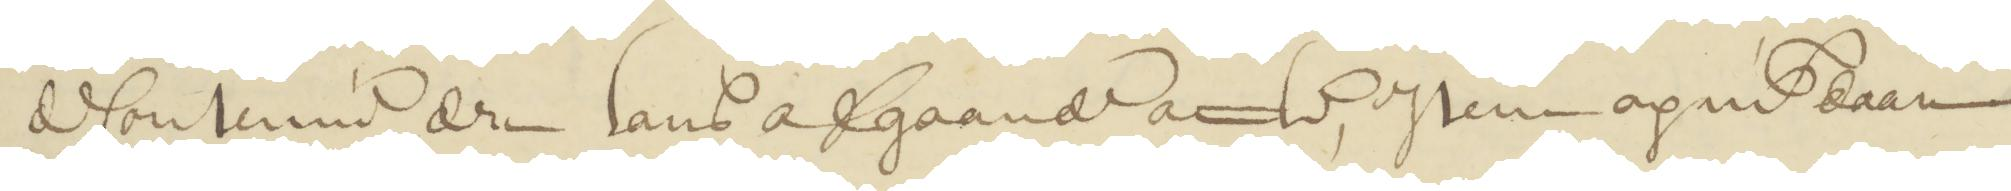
de Continue der tans afgaande acte, Jtem op uE daar
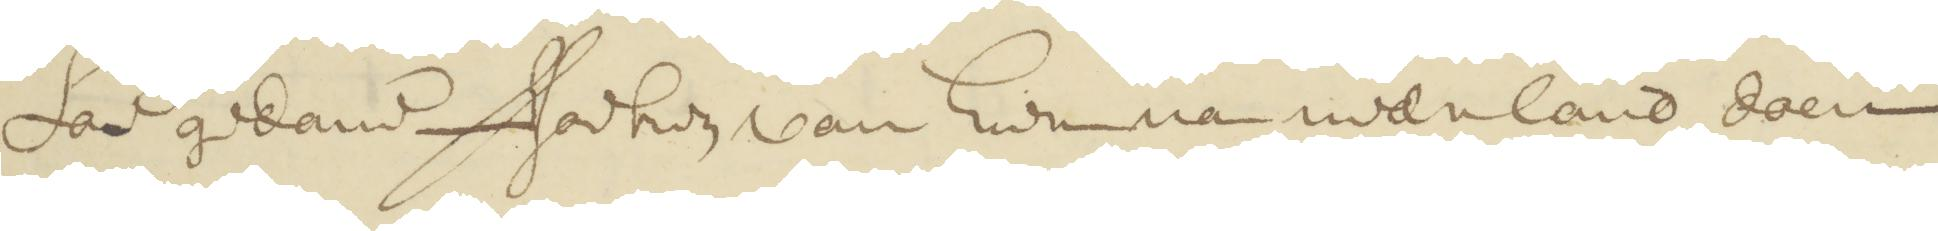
toe gedane versoeken van hier na nederland doen
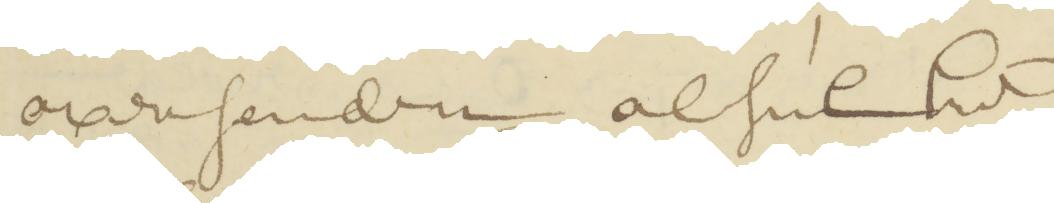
oversenden alsulke
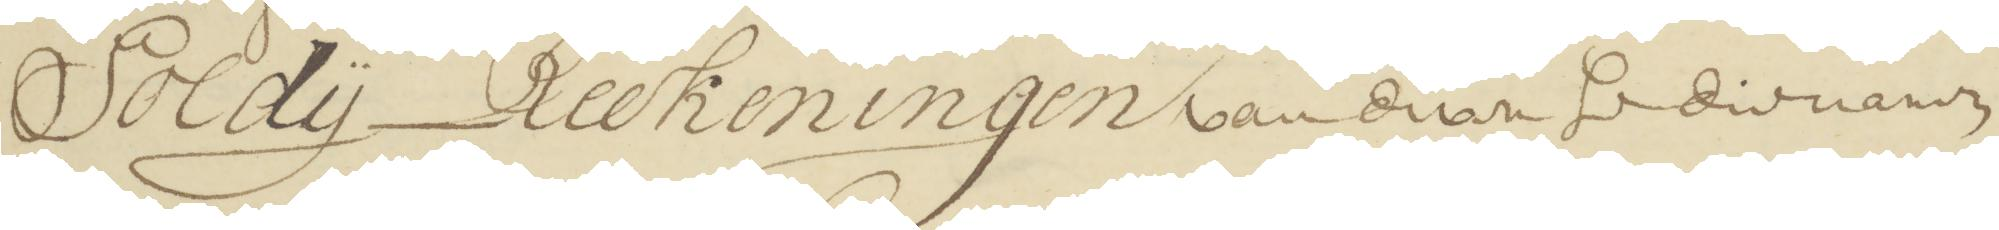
Soldij Reekeningen van diverse dienaren
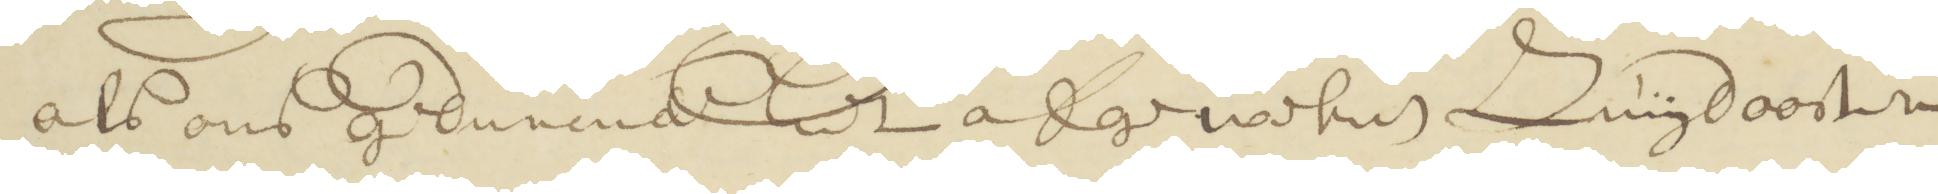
als ons gedurende het afgeweken Zuijdooster
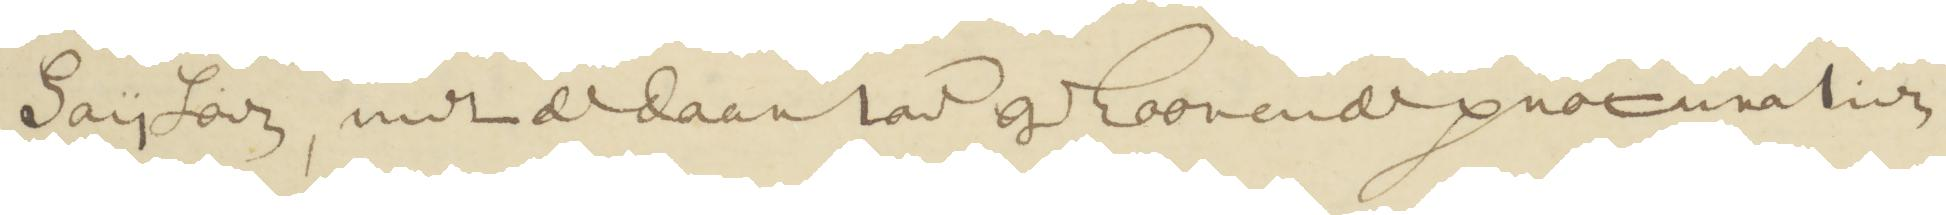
Saijsoen, met de daar toe gehoorende procuratien
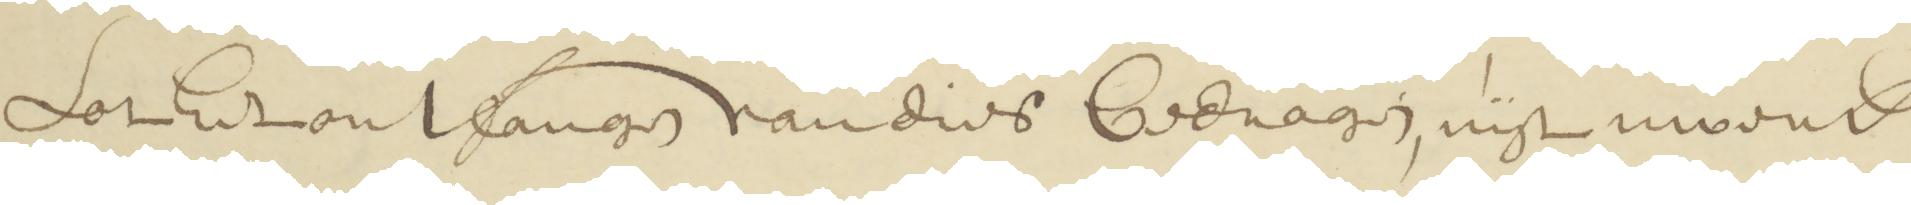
tot het ontfangen van dies bedragen, uijt uwer E
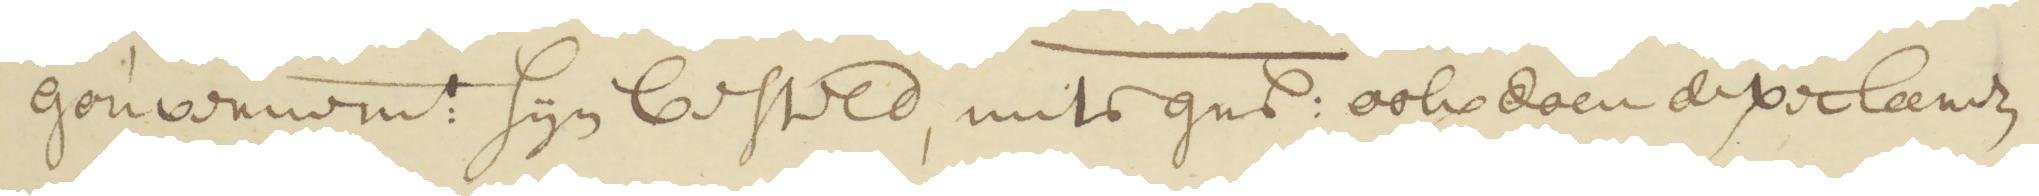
gouvernem:t sijn besteld, mitsgrs: ook doen depecheeren
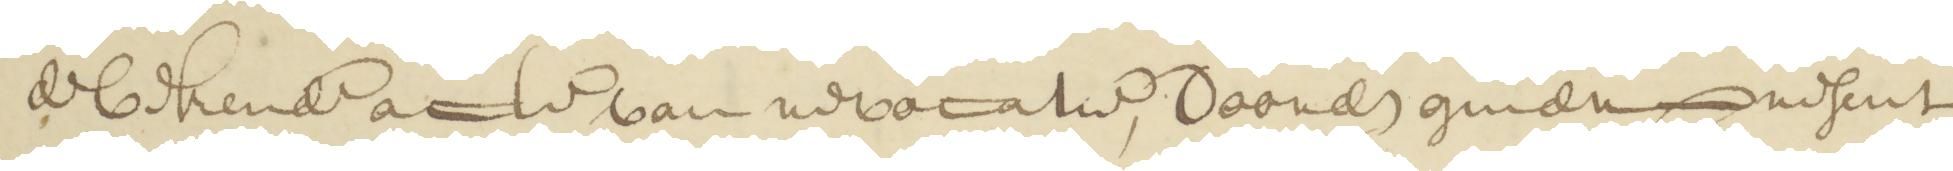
de bekende acte van revocatie, Doorden ginder present
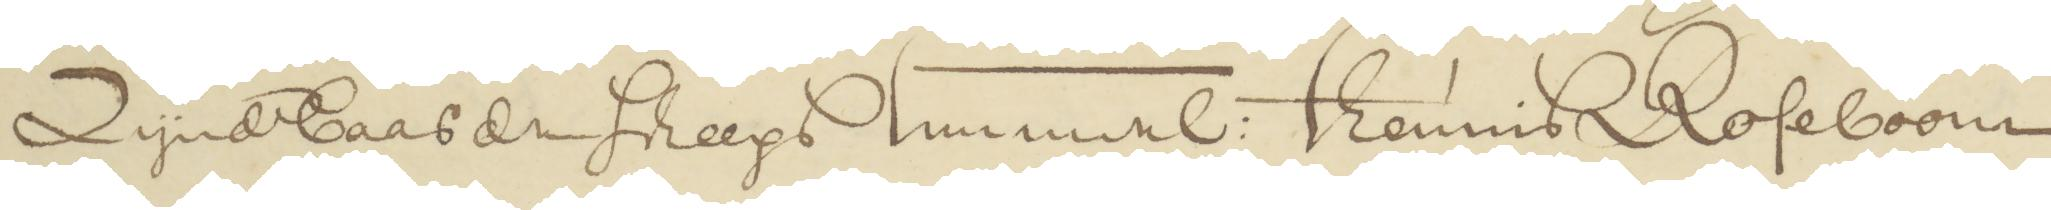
Zijnde baas der scheepstimmerl: Theunis Roseboom
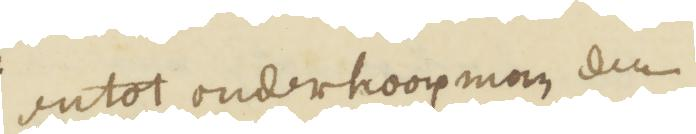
en tot onderkoopman een
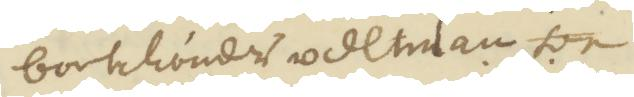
boekhouder veltman ter
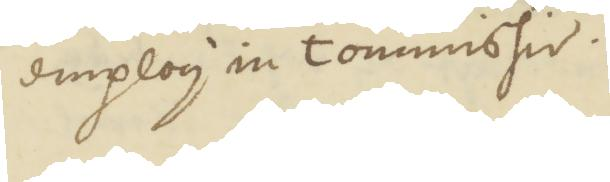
emploij in commissie.
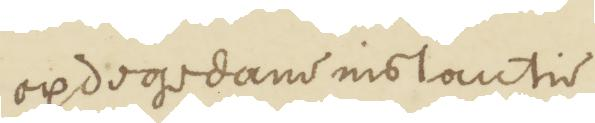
op de gedane instantie
